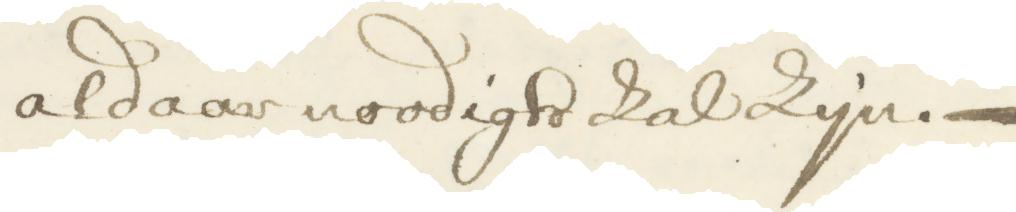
aldaar noodigh zal zijn.
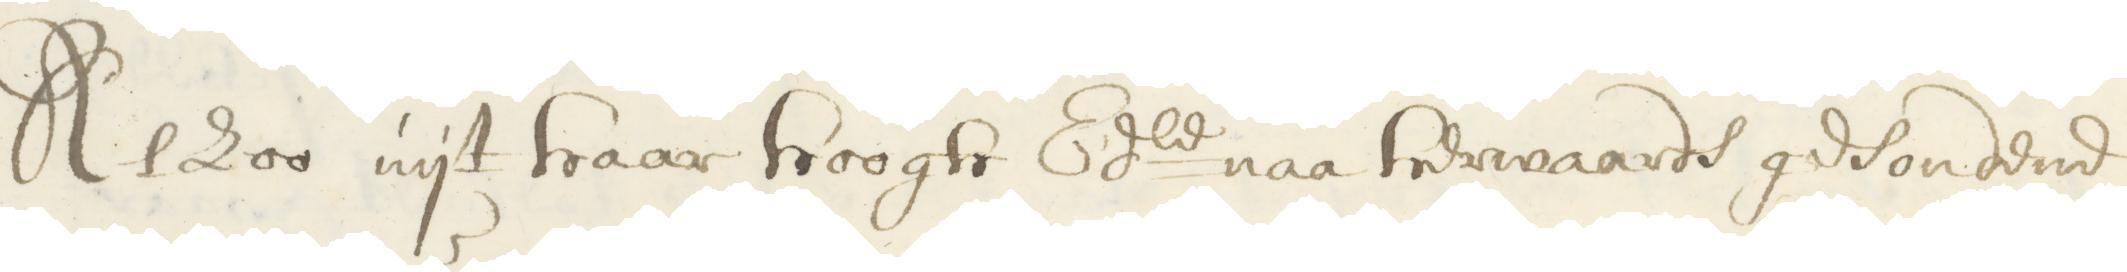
Alzoo uijt haar hoogh Ed=le naa herwaards gesondene
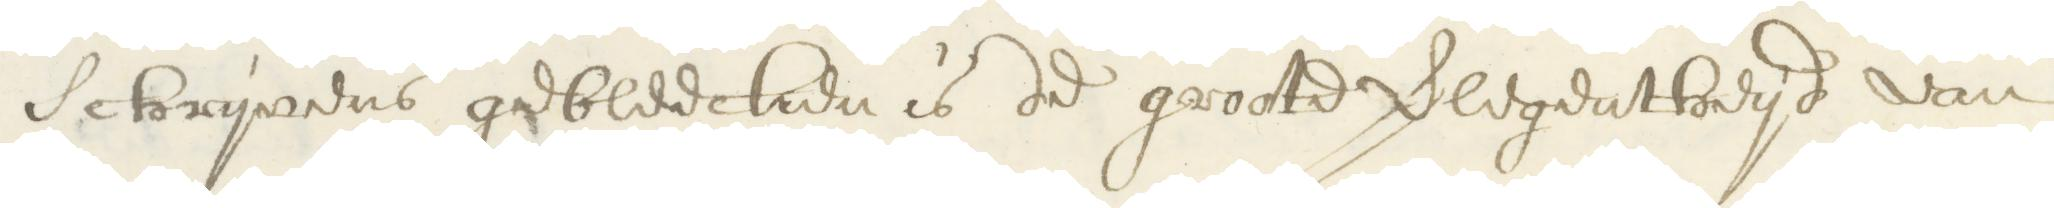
schrijvens gebleecken is de groote verlegentheijd van
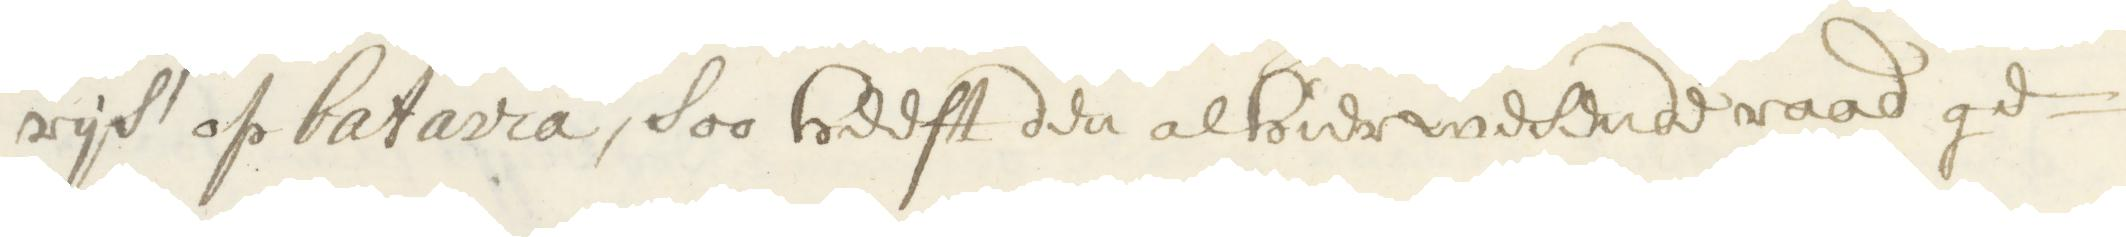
rijs op batavia, soo heeft den alhier wesende raad ge=
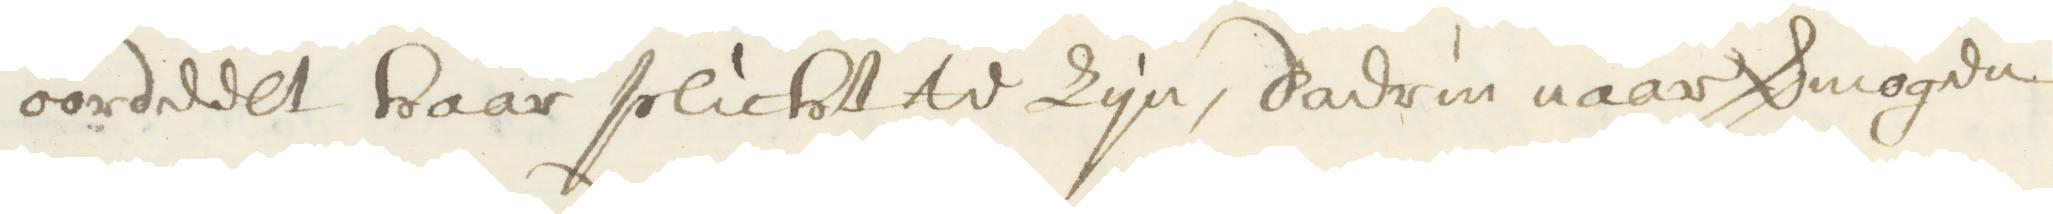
oordeelt haar plicht te zijn, daerin naar vermogen
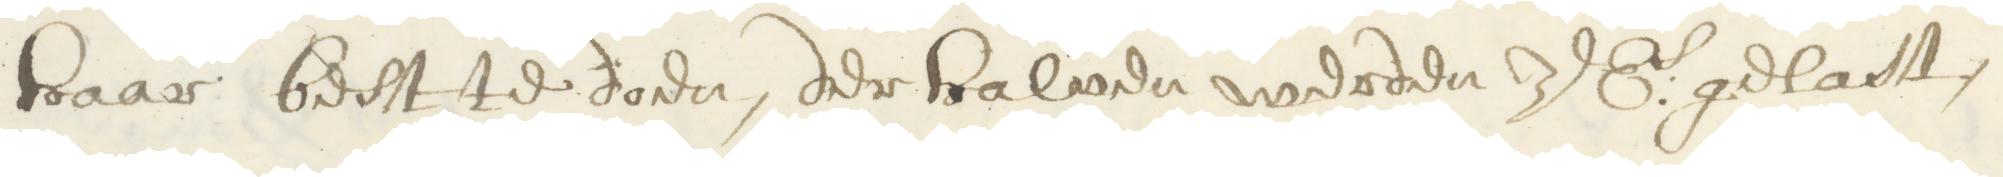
haar best te doen, der halven werden VE:s gelast,
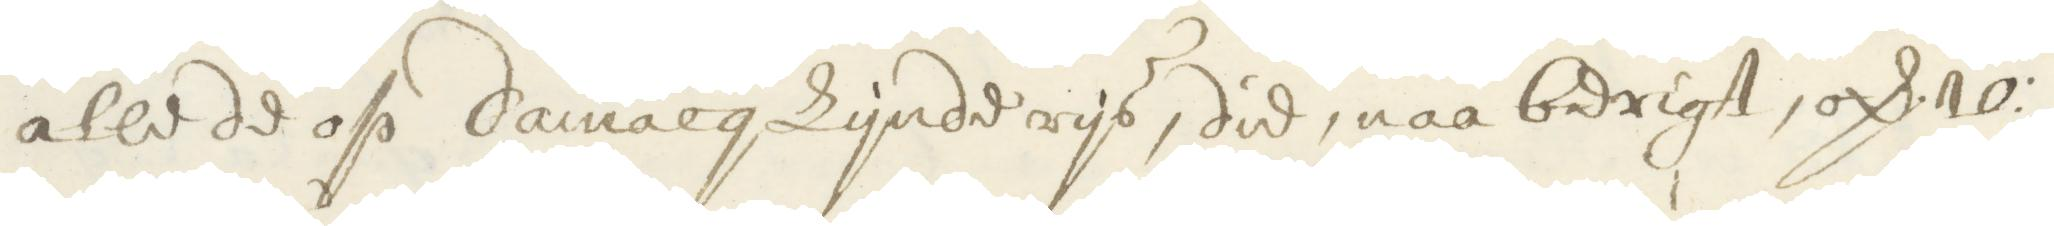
alle de op damacq zijnde rijs, die, naa berigt, over 40:
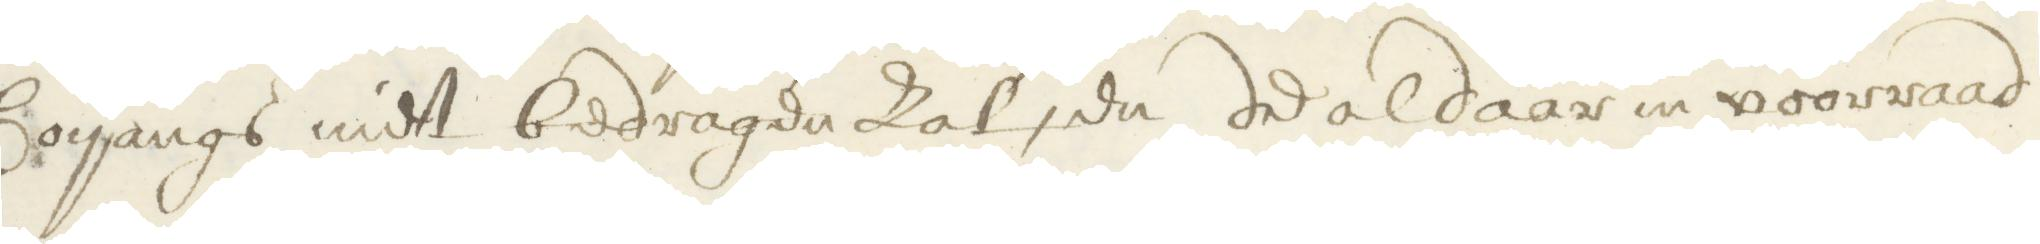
boijangs niet bedragen zal, en de aldaar in voorraad
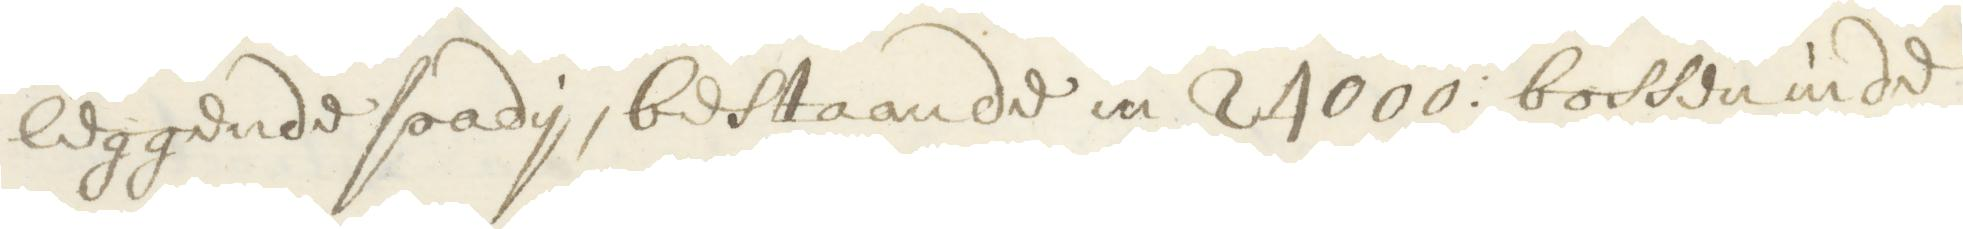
leggende padij, bestaande in 24000: bossen in de
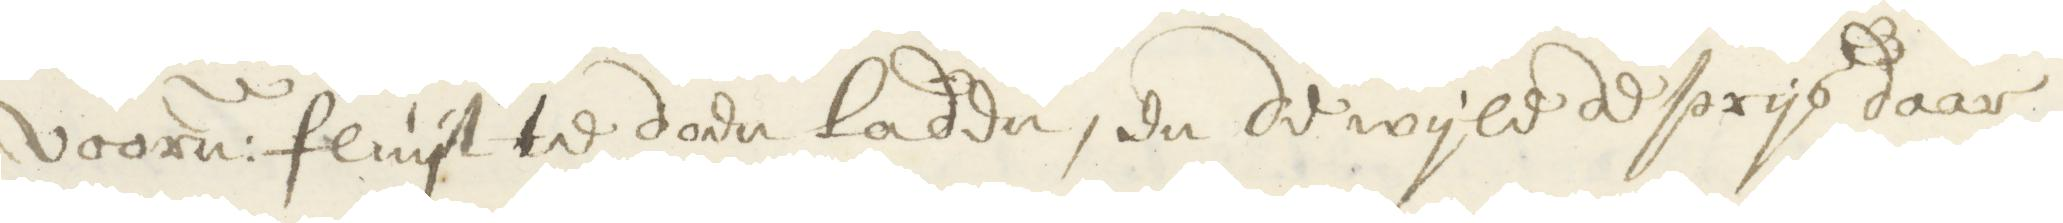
voorn: fluijt te doen laden, en de wijle de prijs daar
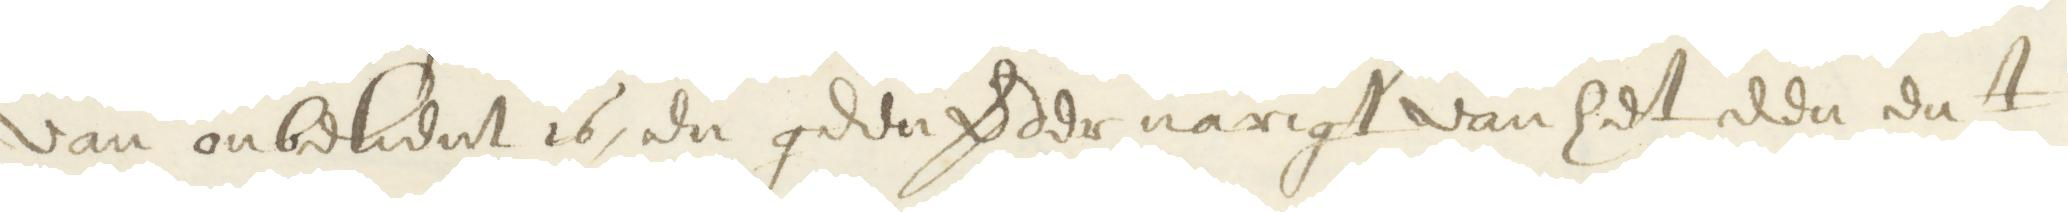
van onbekent is, en geen verder narigt van het een en t'
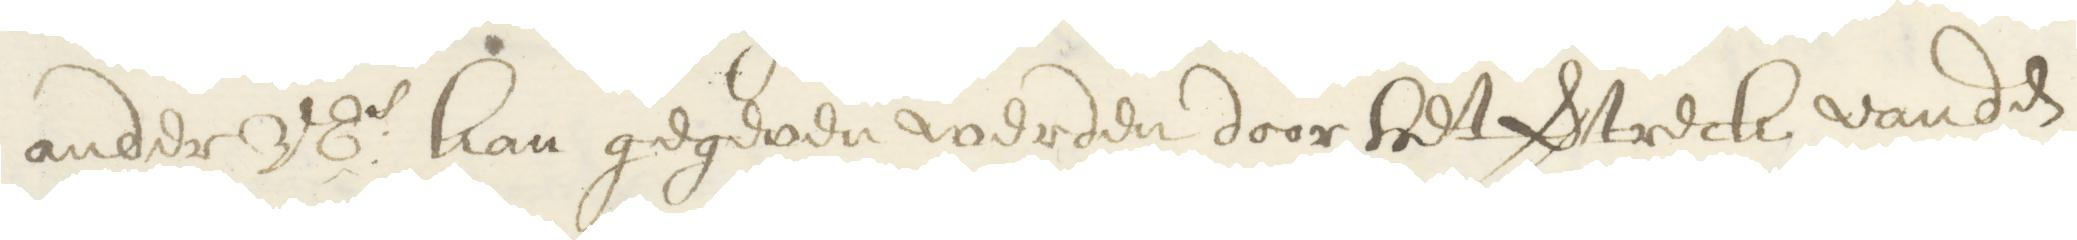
ander VE:s kan gegeven werden door het vertreck van den
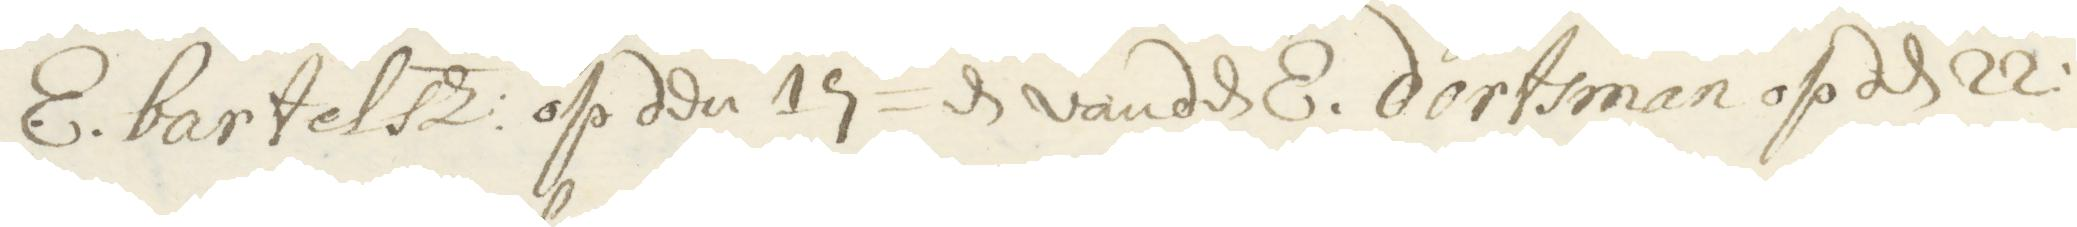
E. bartelsz: op den 17=e en van den E. dortsman op den 22:e
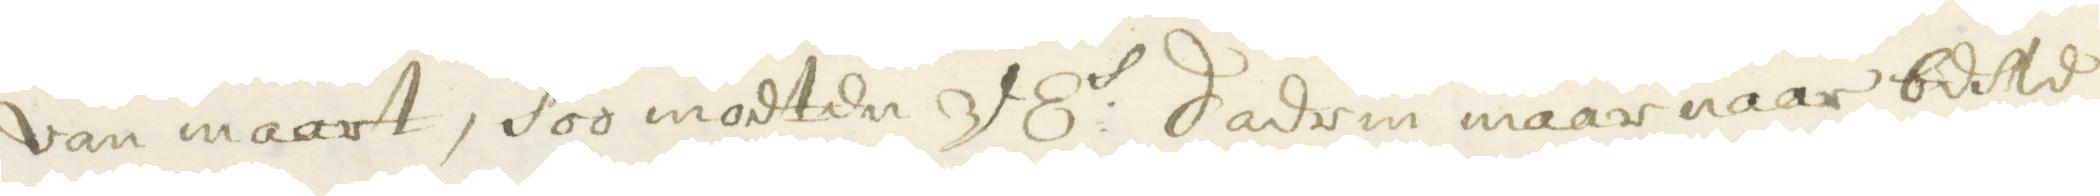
van maart, soo moeten VE:s daerin maar naar beste
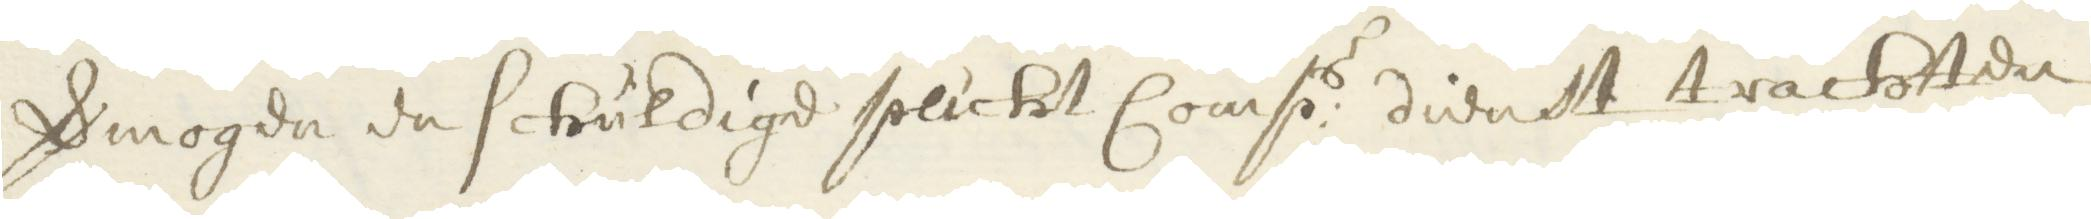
vermogen en schuldige plicht Comp:s dienst trachten
